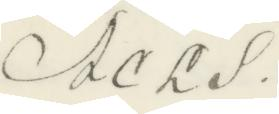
A C L S
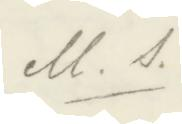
M. S.
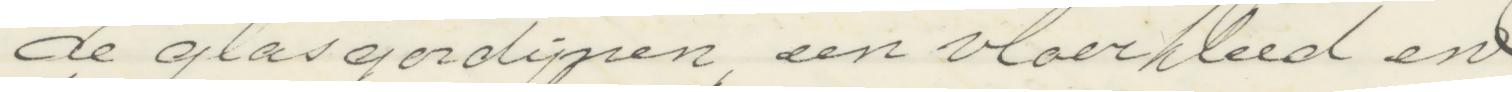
de glasgordijnen, een vloerkleed en
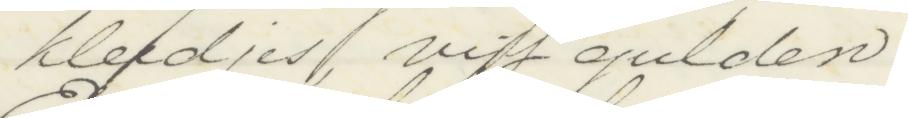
kleedjes, vijf gulden
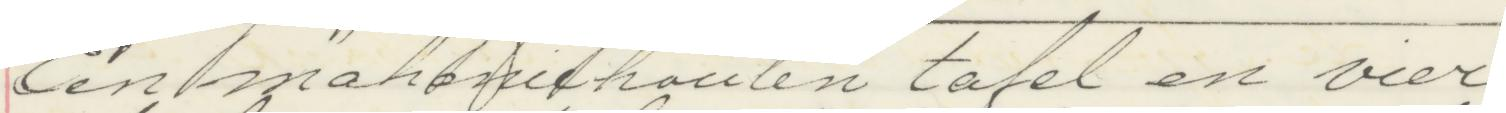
Een mahonie houten tafel en vier
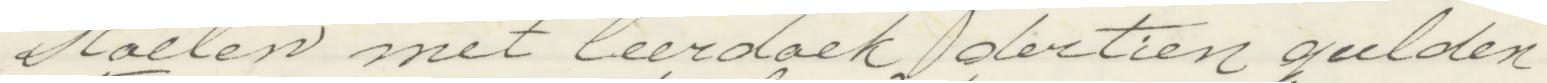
stoelen met leerdoek, dertien gulden
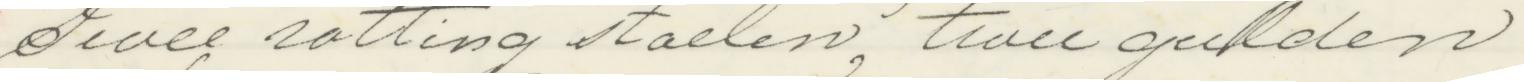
Twee rotting stoelen, twee gulden
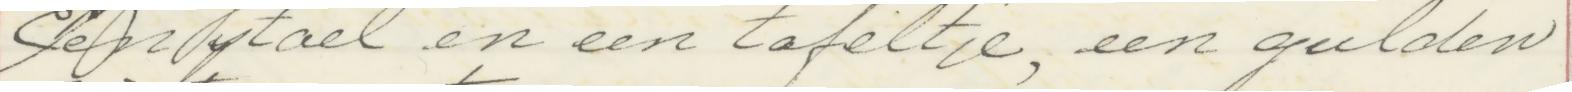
Een stoel en een tafeltje, een gulden
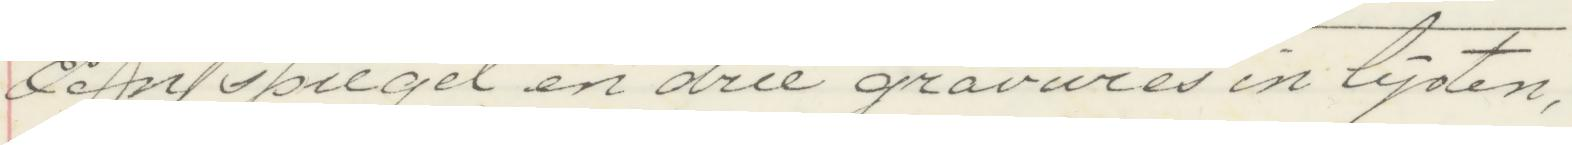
Een spiegel en drie gravures in lijsten,
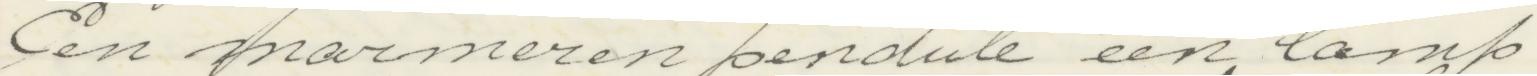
Een marmeren pendule, een lamp
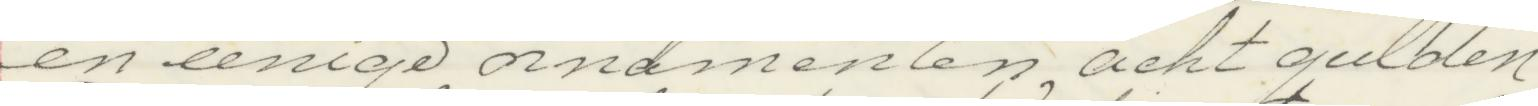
en eenige ornamenten, acht gulden
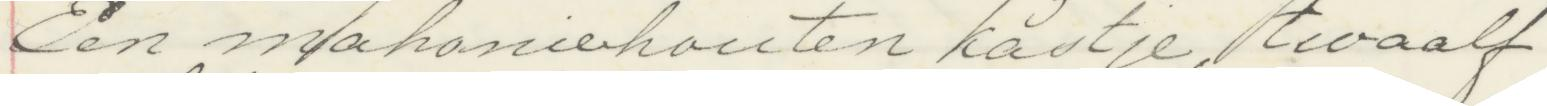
Een mahoniehouten kastje, twaalf
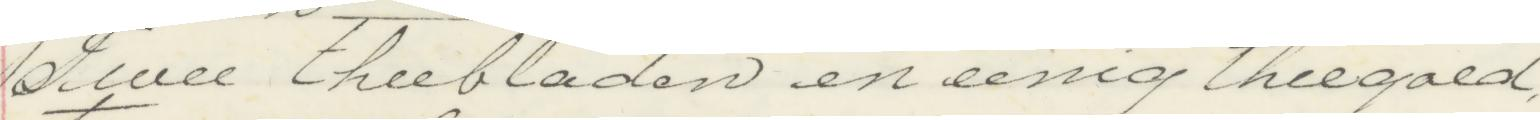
Twee theebladen en eenig theegoed
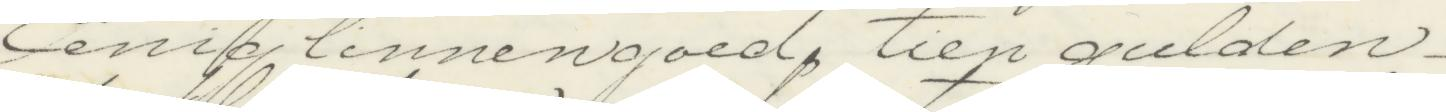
Eenig linnengoed, tien gulden
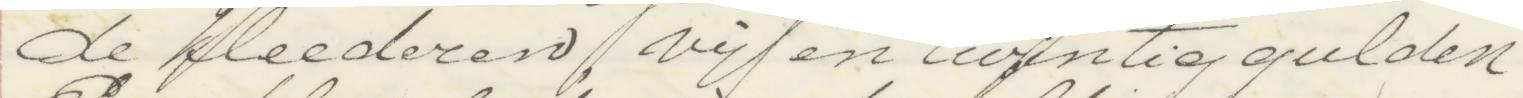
de kleederen, vijf en twintig gulden
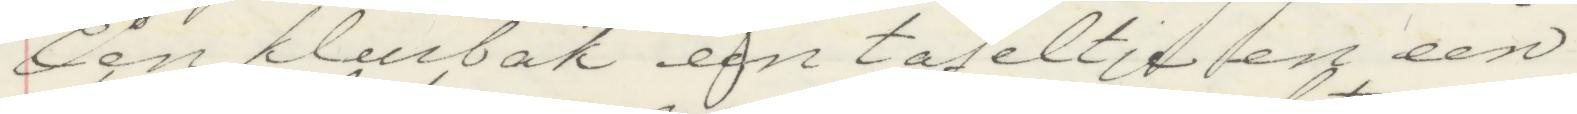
Een kleerbak een tafeltje en een
